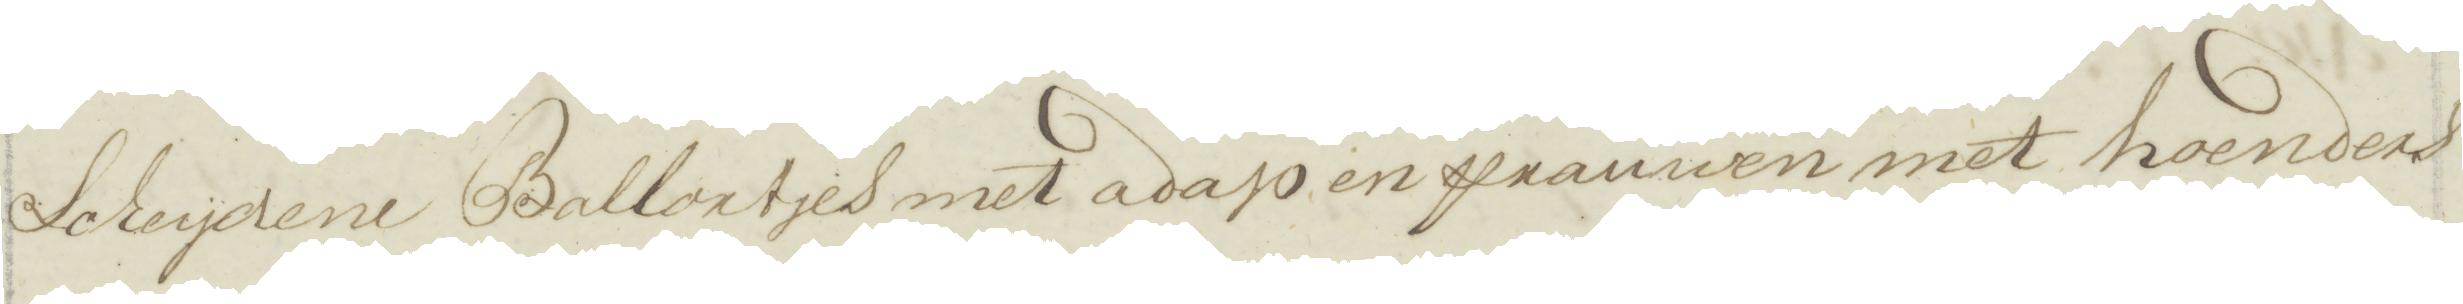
scheijdene Ballortjes met adap en prauwen met hoenders
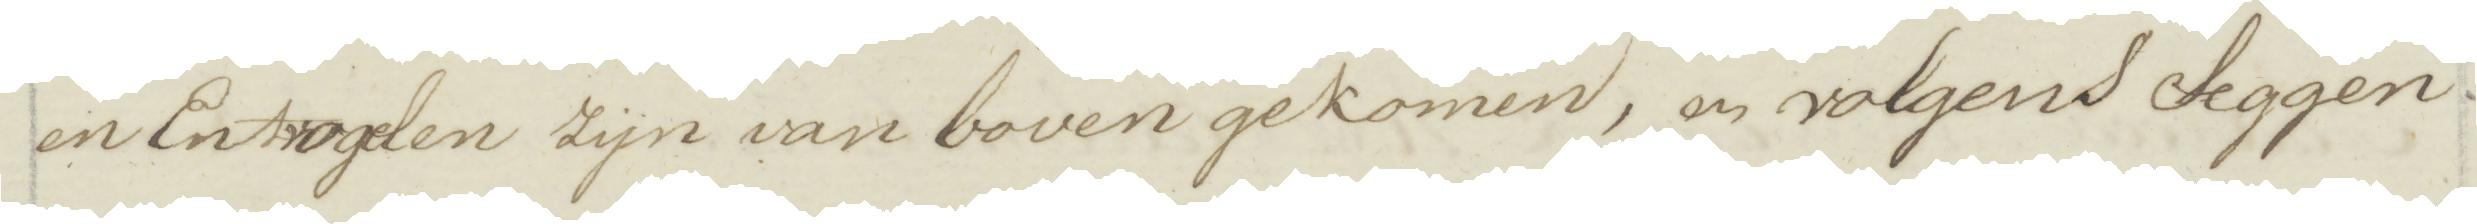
en Entvogelen zijn van boven gekomen, en volgens seggen
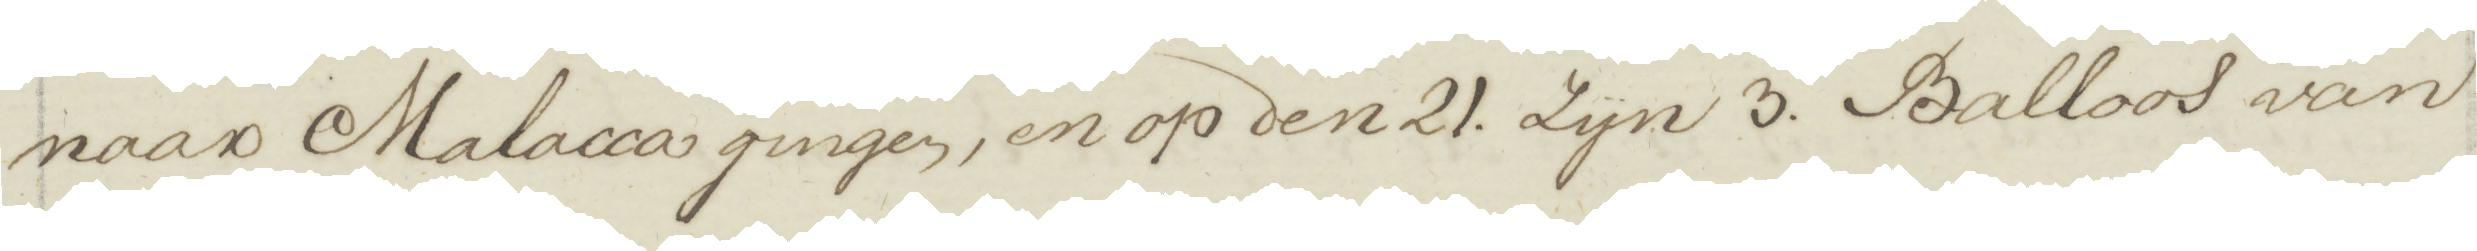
naar Malacca gingen, en op den 21. zijn 3. Balloos van
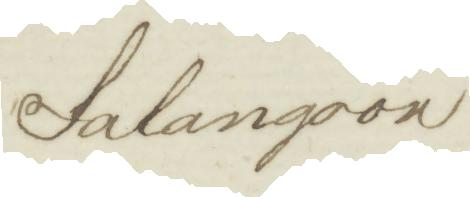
Salangoor
